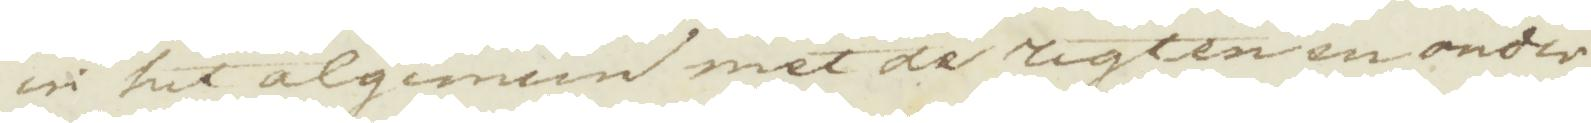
in het algemeen met de regten en onder
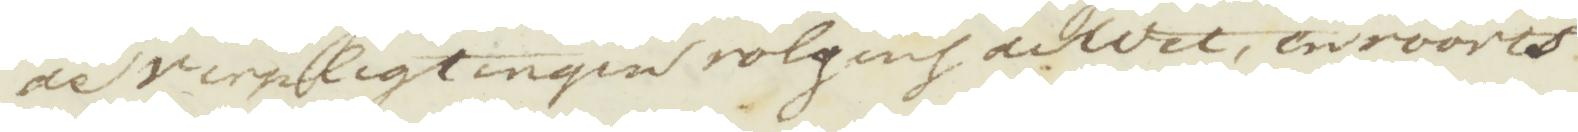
de verpligtingen volgens de wet, en voorts
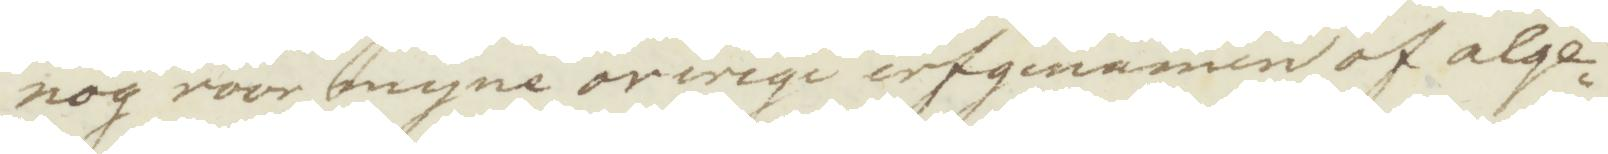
nog voor myne overige erfgenamen of alge„
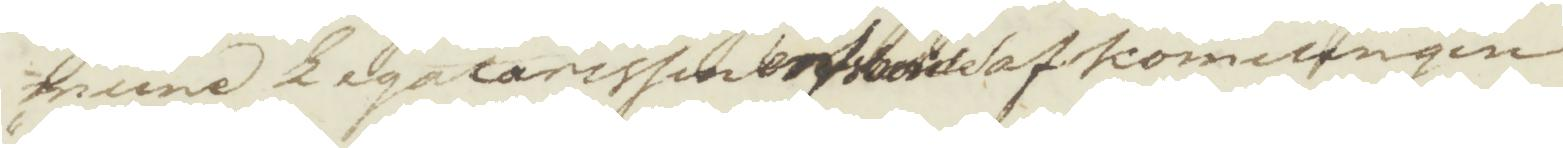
meene Legatarissen en voor afkomelingen
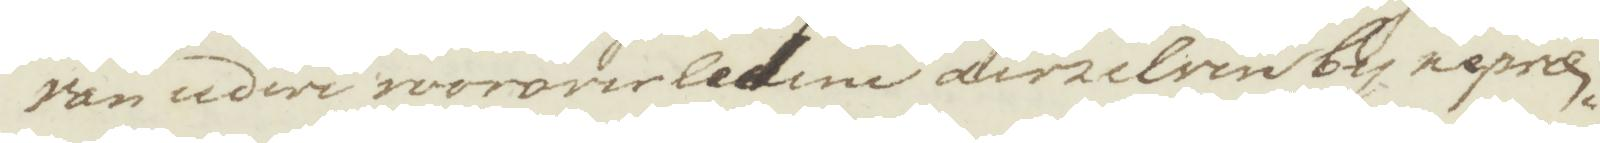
van iedere vooroverledene derzelven by reprae„
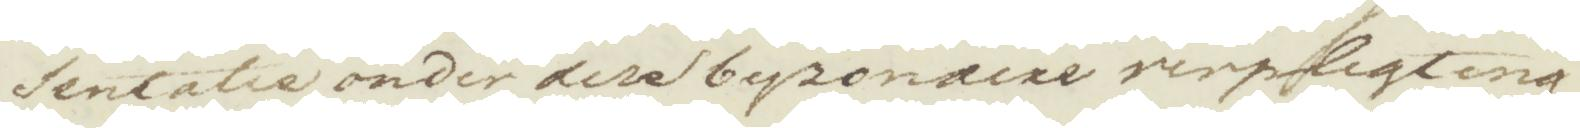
sentatie onder deze byzondere verpligting
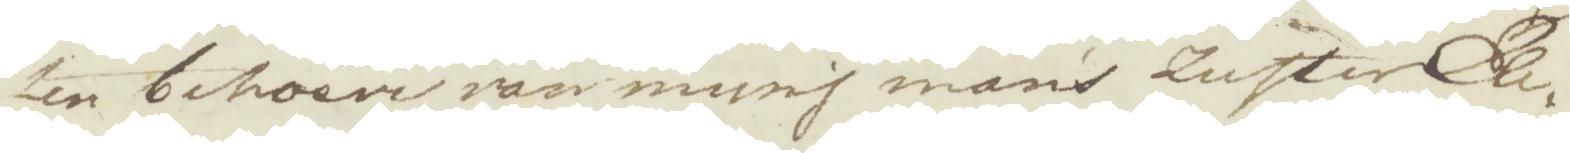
ten behoeve van myns mans zuster Eli,
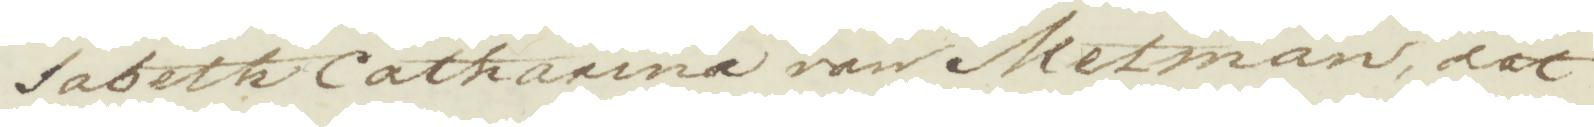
sabeth Catharina van Metman, dat
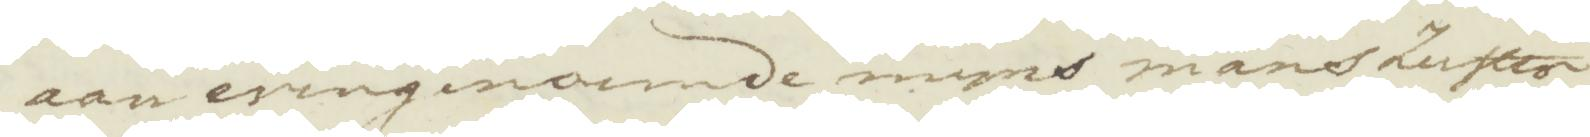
aan evengenoemde myns mans zuster
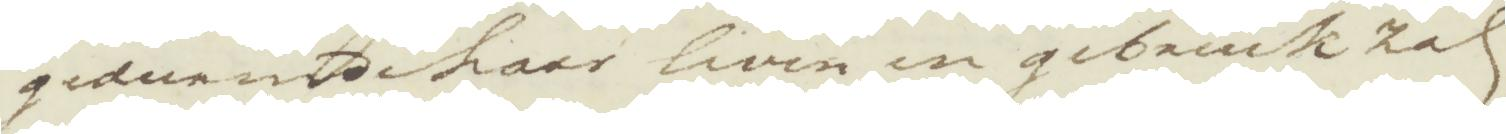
gedurende haar leven in gebruik zal
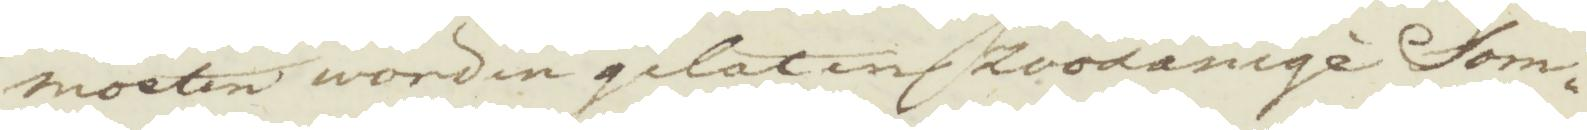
moeten worden gelaten zoodanige Som„
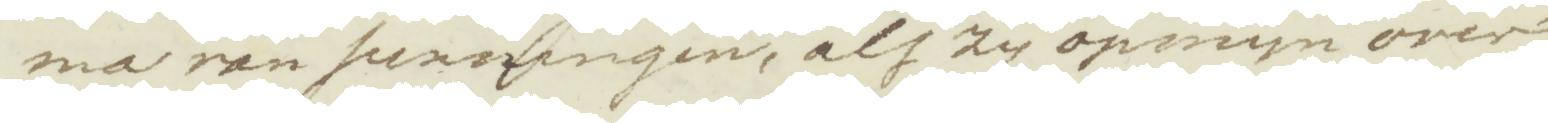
ma van penningen, als zy op myn over„
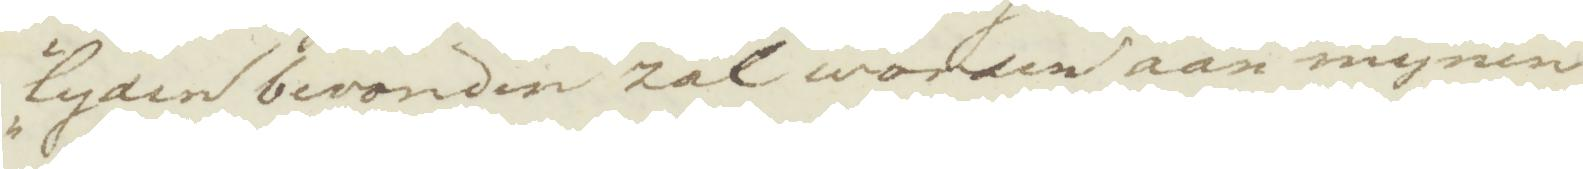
„lyden bevonden zal worden aan mynen
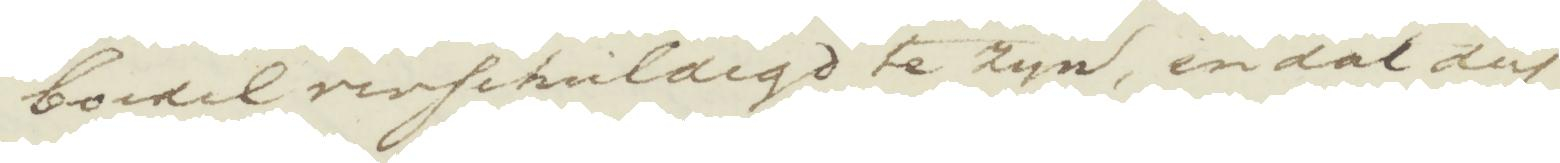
boedel verschuldigd te zyn, en dat dus
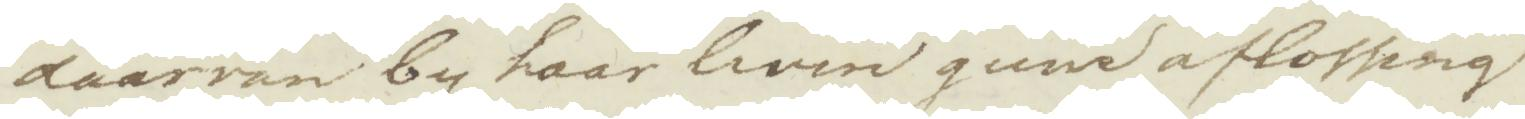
daar van by haar Erven geene aflossing
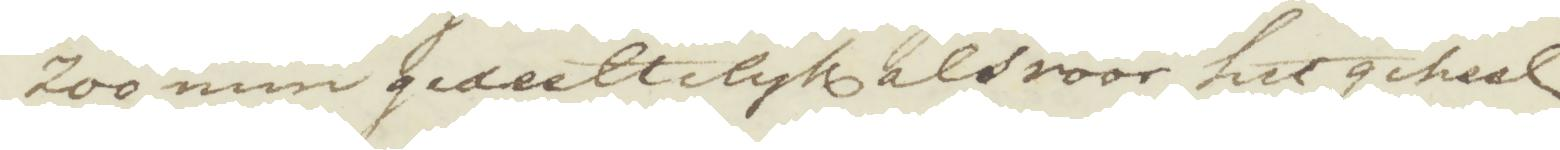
zoo min gedeeltelyk als voor het geheel
